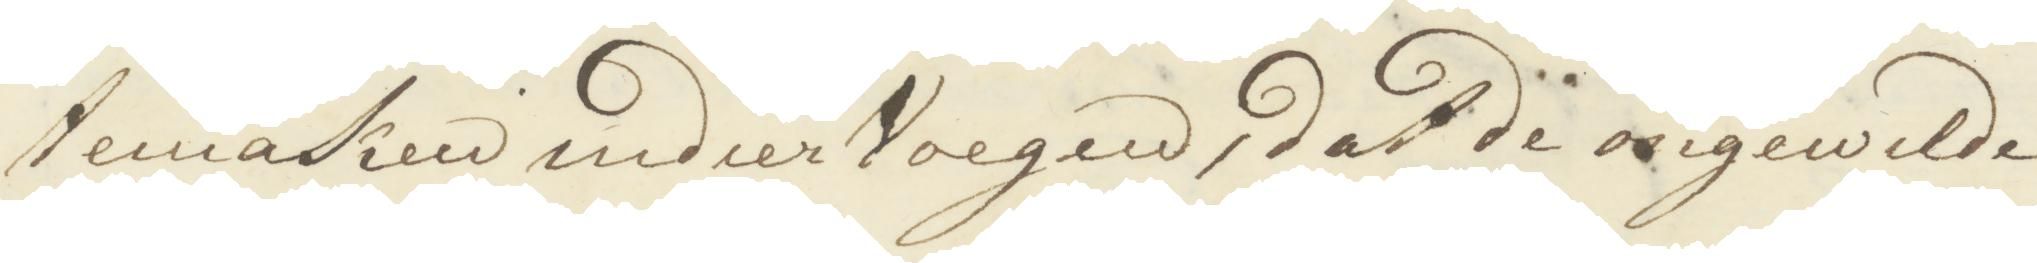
temaken indier voegen, dat de ongewilde
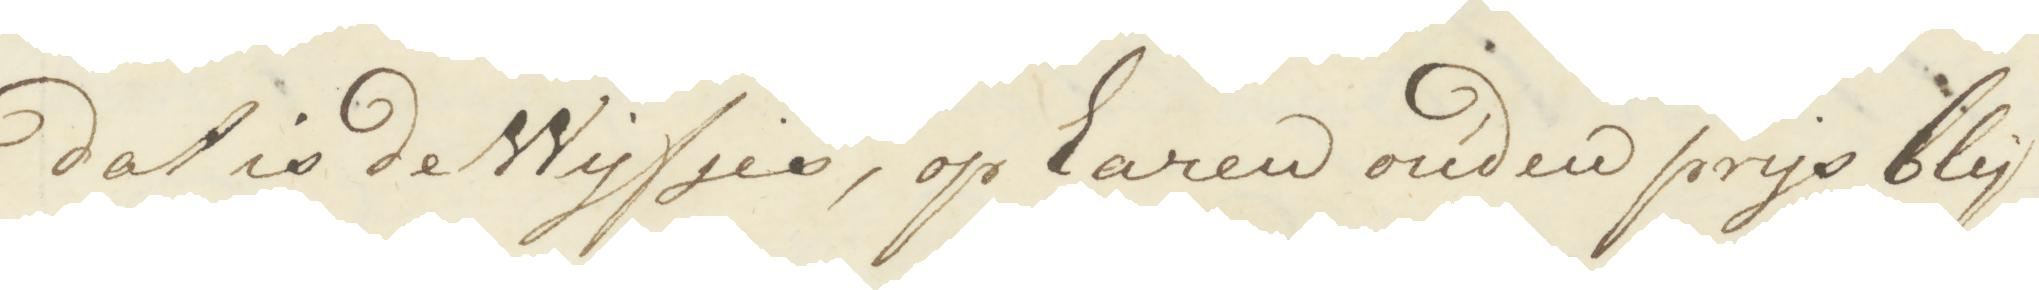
dat is de Wijfjes, op haren ouden prijs blij
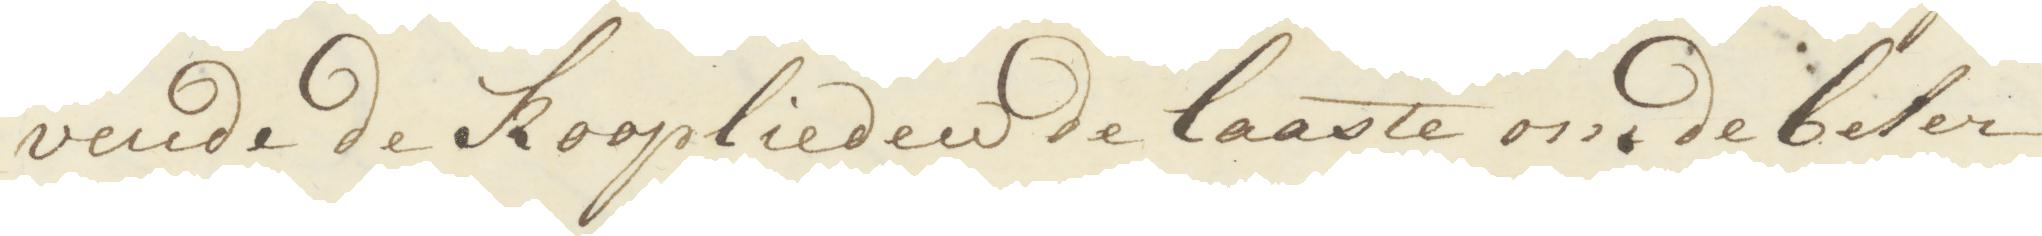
vende de Kooplieden de laaste om de beter
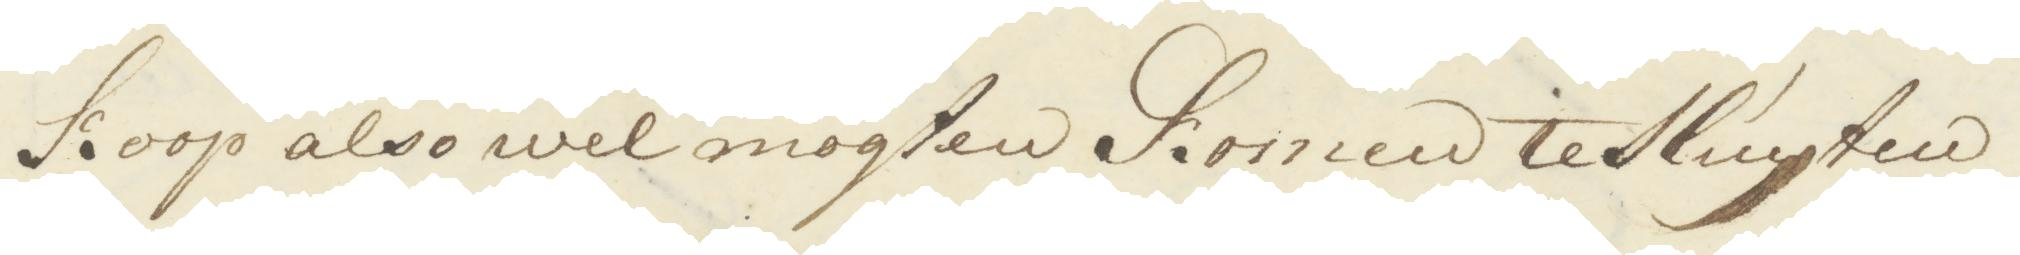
koop also wel mogten komen te sluyten
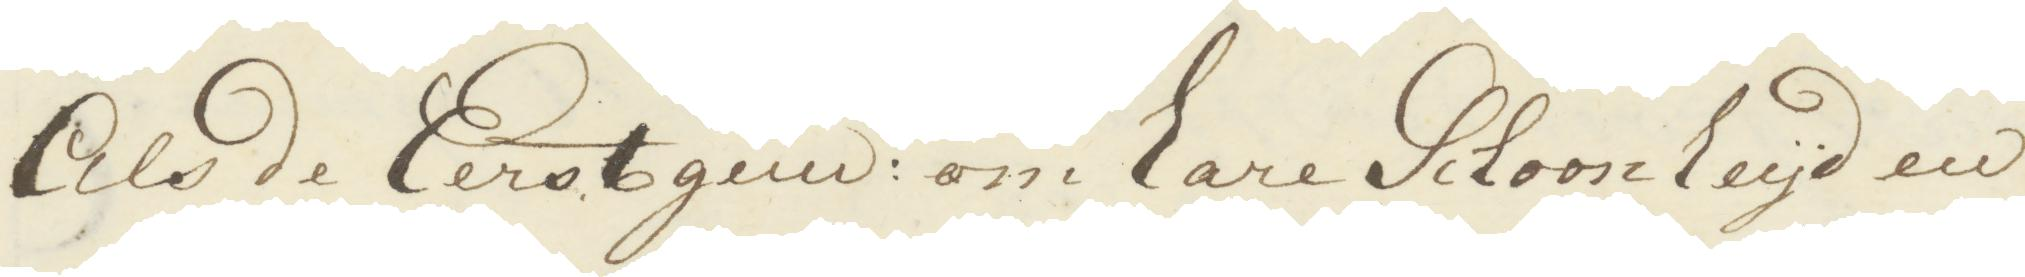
Als de Eerst gem: om hare schoonheijd en
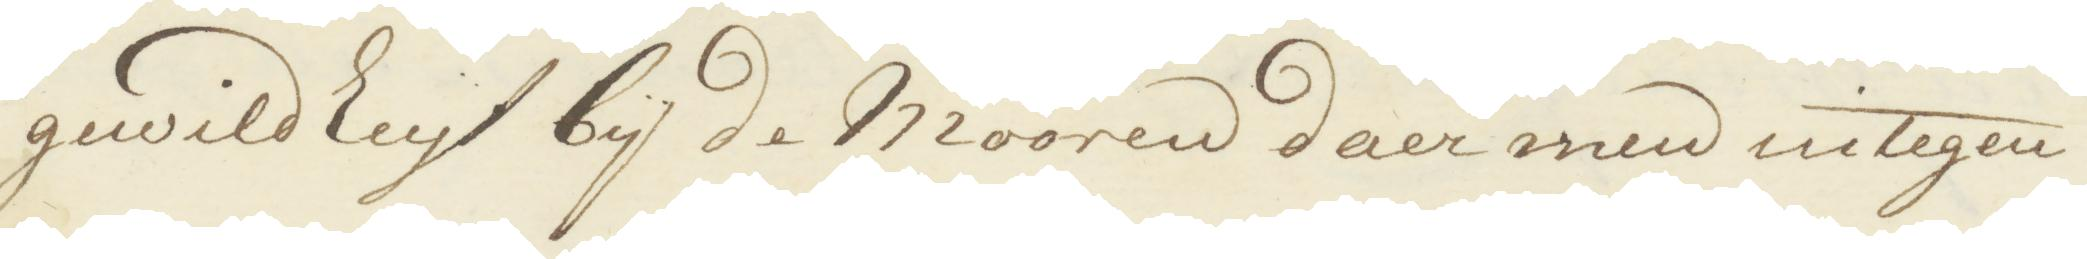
gewildheijt bij de mooren daer men integen
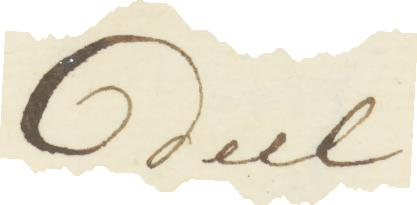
deel
